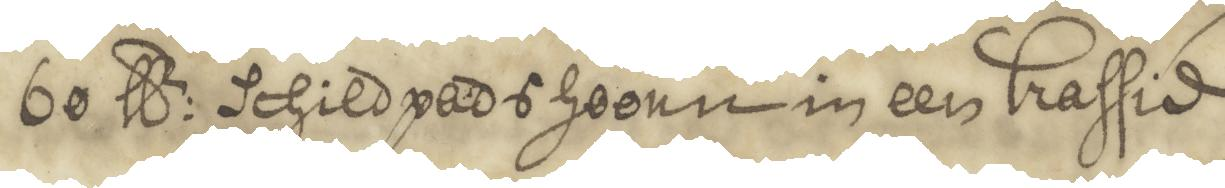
60 lb: schildpads hoorn in een kassie
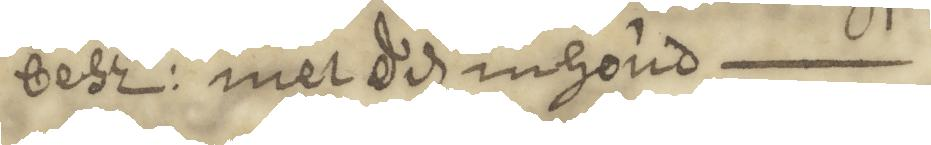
besz: met den inhoud —
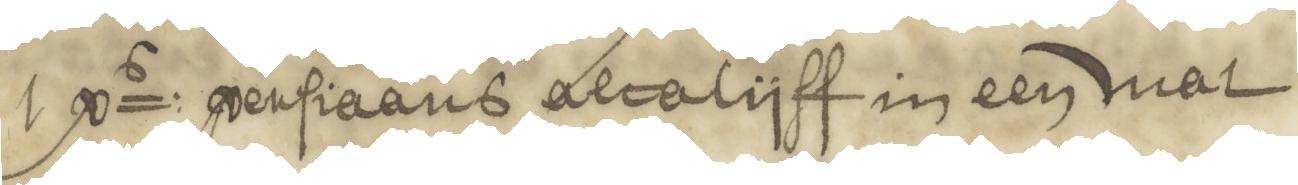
1 p=s: persiaans alcatijff in een mat
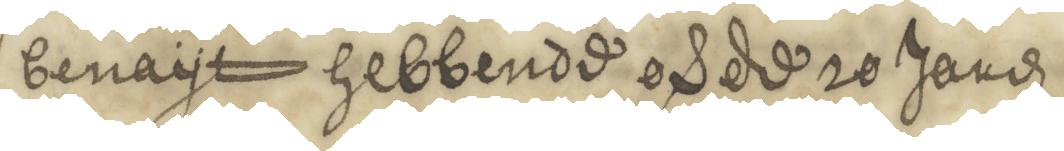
benaijt hebbende over de 20 Jaren
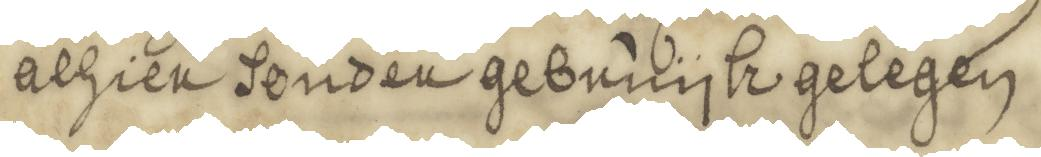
alhier sonder gebruijk gelegen
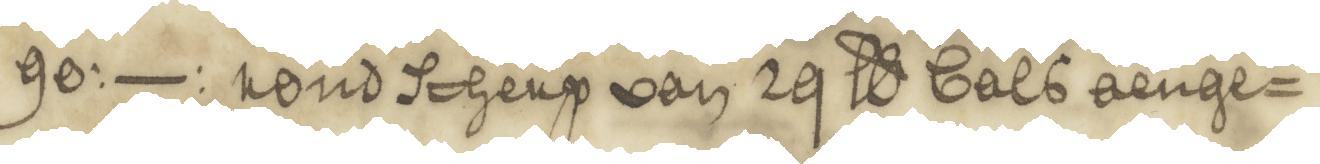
90: —: rond scherp van 29 lb bals aenge=
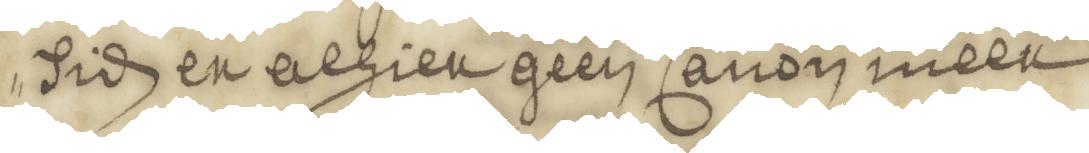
„sien er alhier geen Canon meer
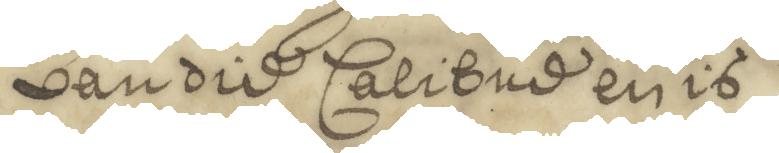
van die Calibre en is
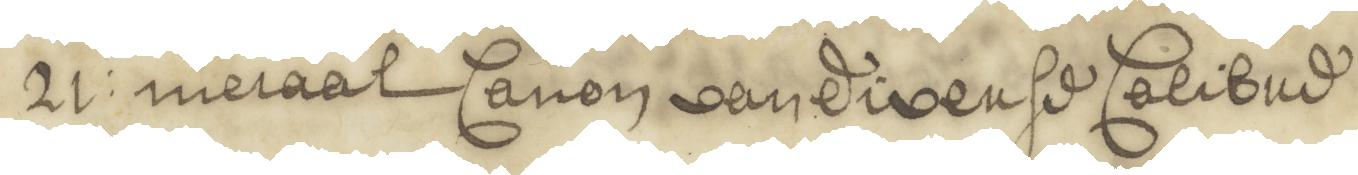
21: metaal Canon van diverse Calibre
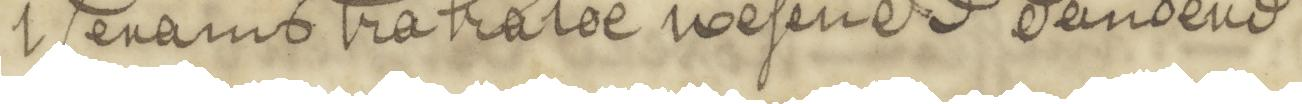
1 Cerams kakatoe wesende dandere
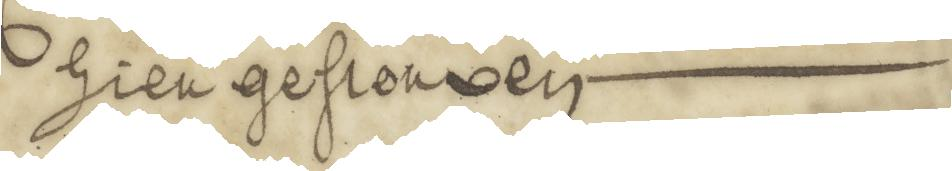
hier gestorven —
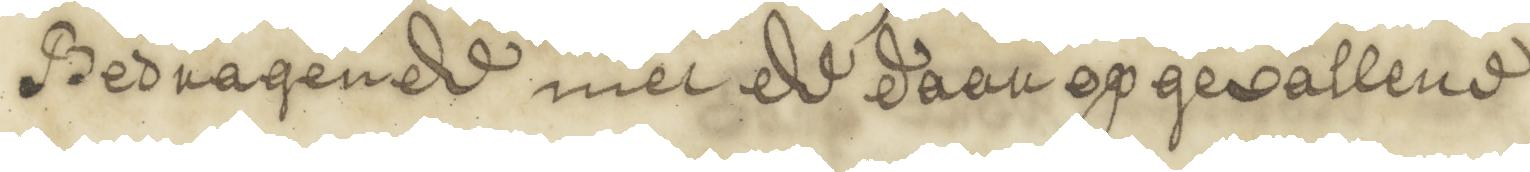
Bedragende met de daar op gevallene
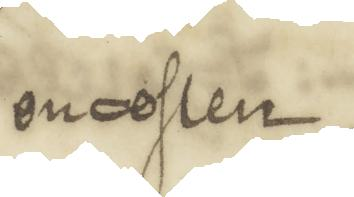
oncosten
